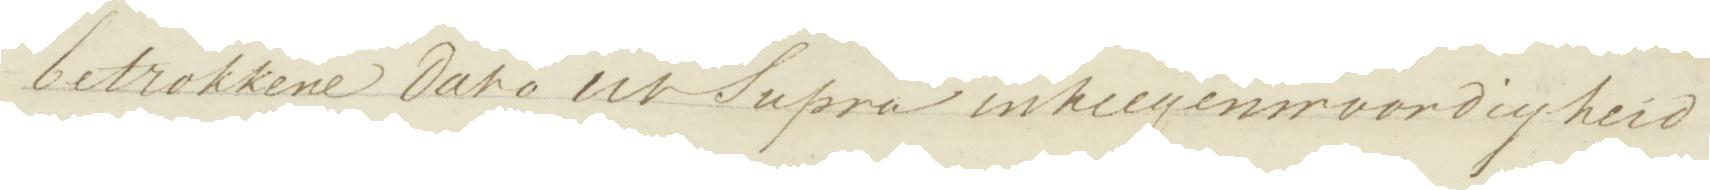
betrokkene Dato ut supra in teegenwoordigheid
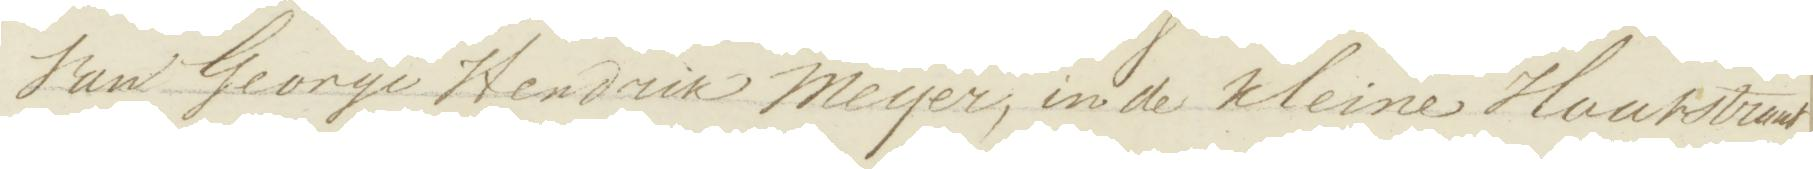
van George Hendrik Meyer, in de kleine Haarstraat
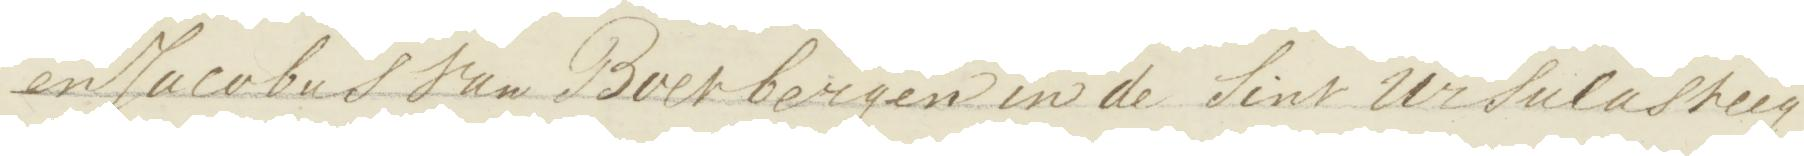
en Jacobus van Boetbergen in de sint Ursulasteeg
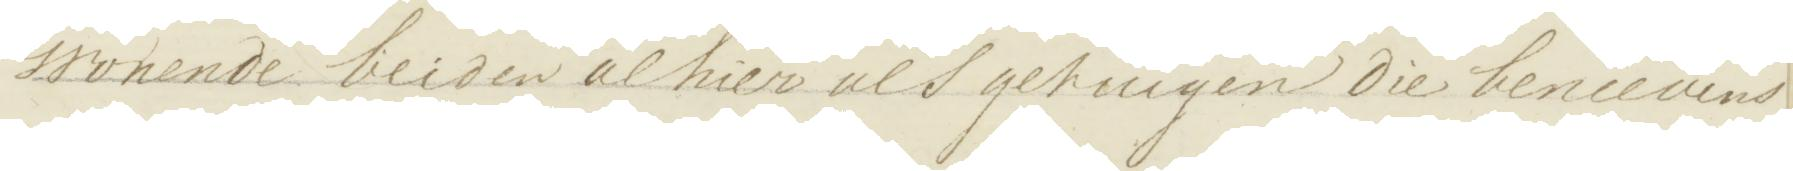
wonende beiden alhier als getuigen die beneevens
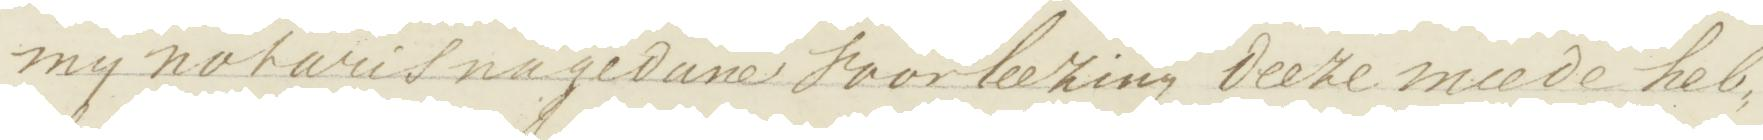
my notaris na gedane Voorleezing deeze meede heb„
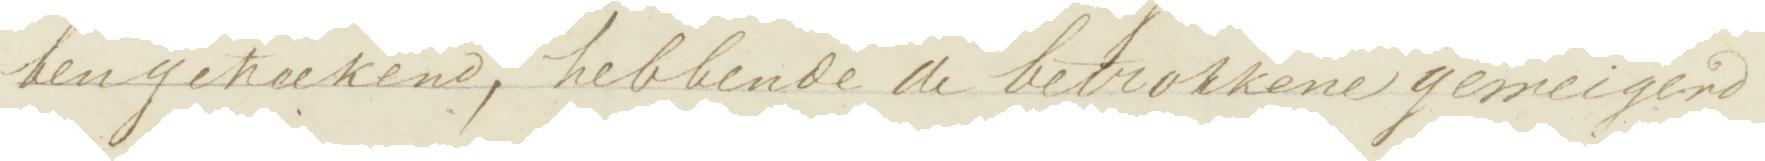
ben geteekend, hebbende de betrokkene geweigerd
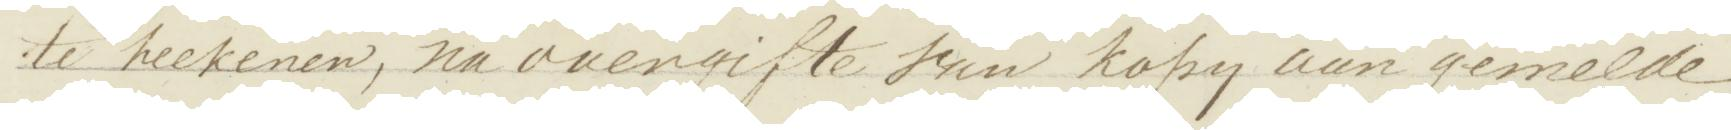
te teekenen, na overgifte van kopy aan gemelde
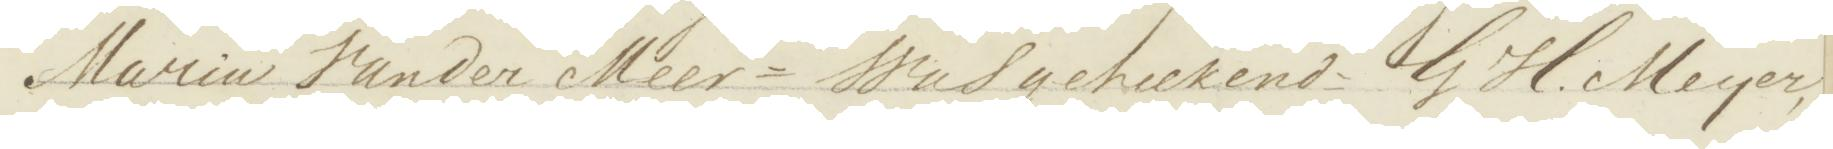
Maria van der Meer = Was geteekend = G H. Meyer,
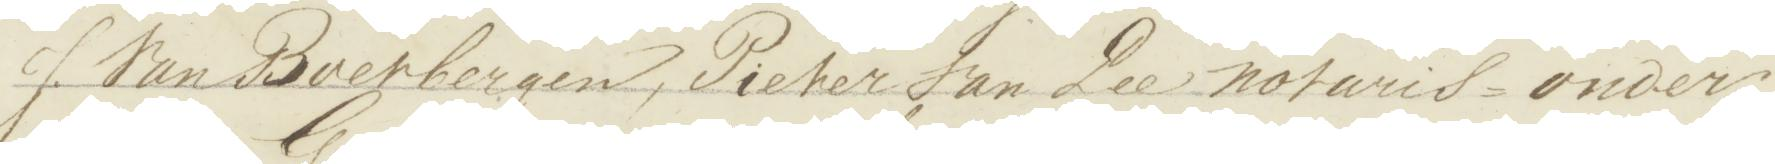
J. van Boetbergen, Pieter van Lee notaris = onder
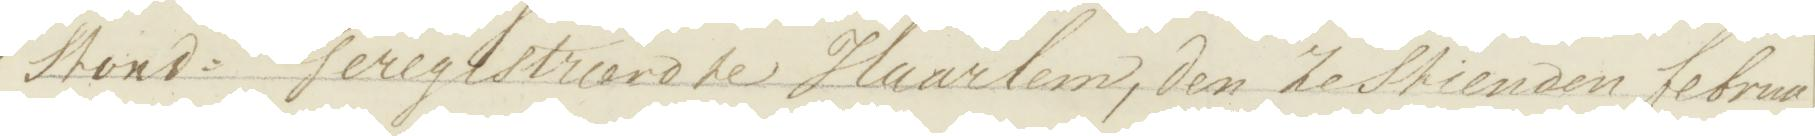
stond = Geregistreerd te Haarlem, den zestienden februa
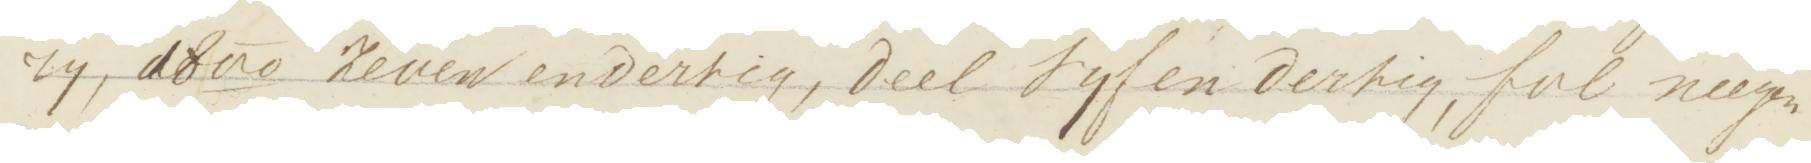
ry, 1800 zeven en dertig, deel Vyf en dertig, fol neegen
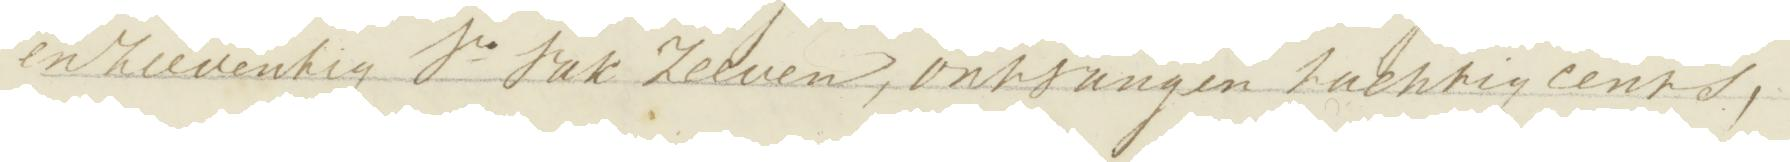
en zeeventig V-o vak Zeeven, ontvangen tachtig cents,
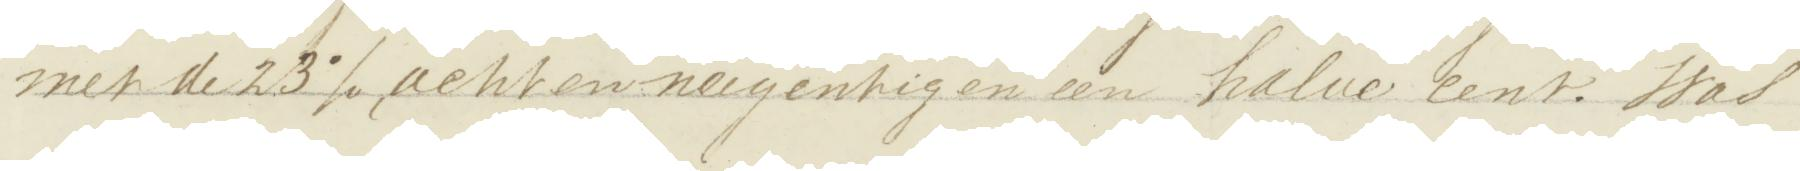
met de 23%, acht en neegentig en een halve cent. Was
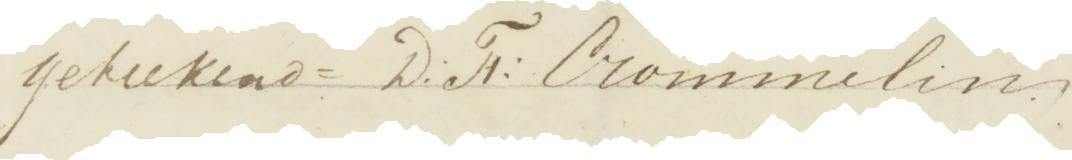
geteekend = D: F: Crommelin
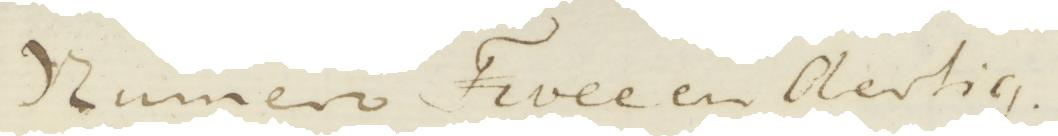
Numero Twee en dertig.
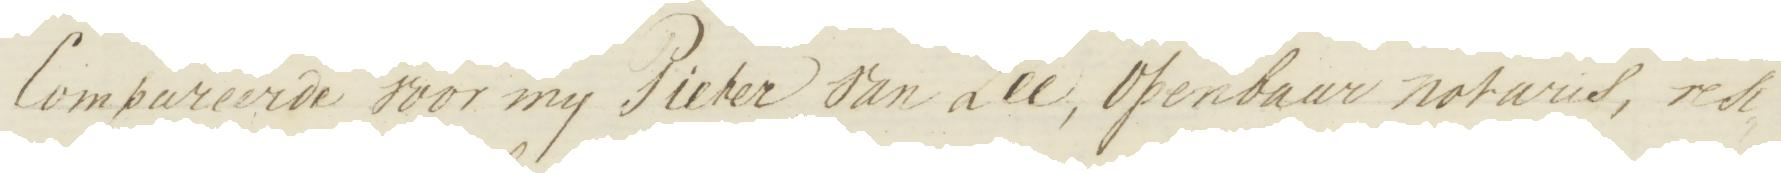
Compareerde voor my Pieter van Lee, Openbaar notaris, resi„
